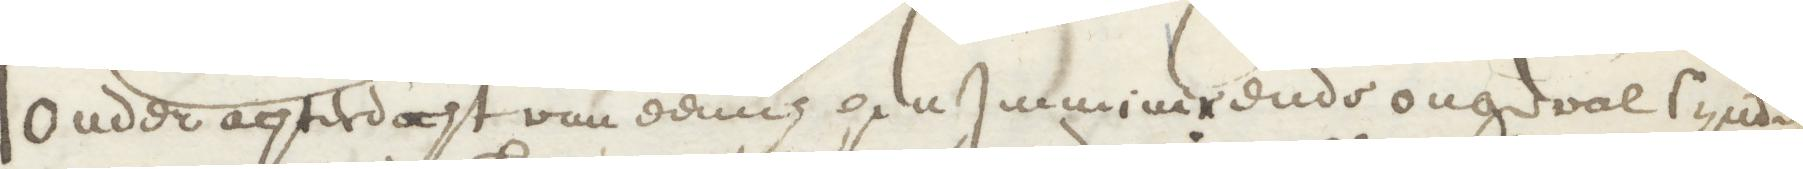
Sonder agterdocht van eenich genjeerinerende ongeval synde
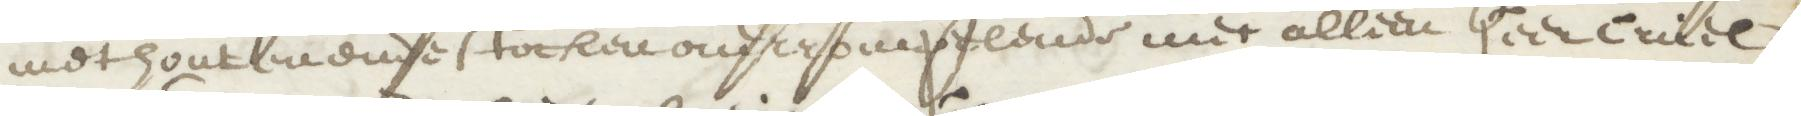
met houten ende stocken onder rompelende niet alleen seer cruel
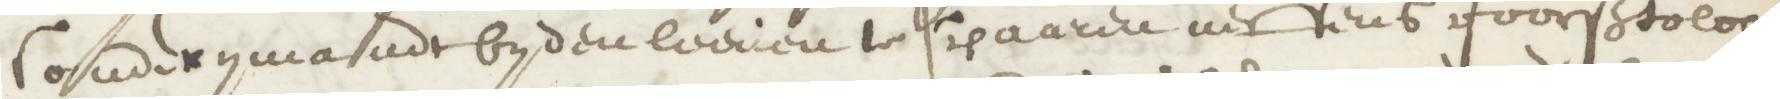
sonder ymandt by den leeuen te spaaren neffens voorsz tolcq
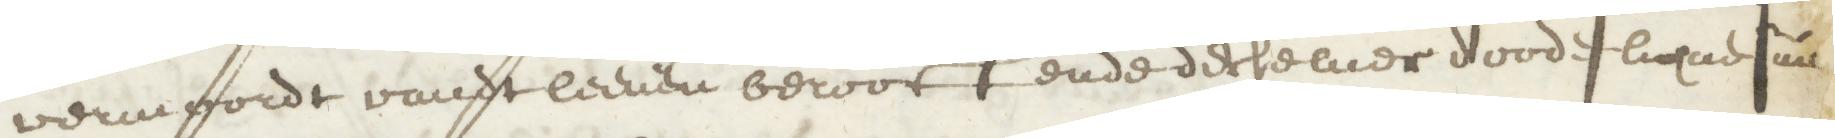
vermoordt vandt leeuen berooft ende derselver doodelique in
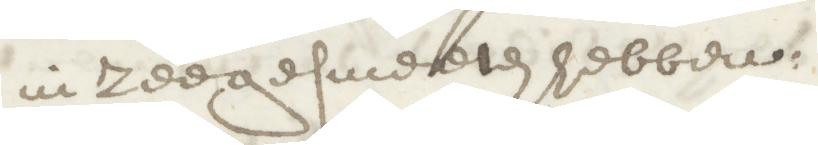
in zee gesmeeten hebben:
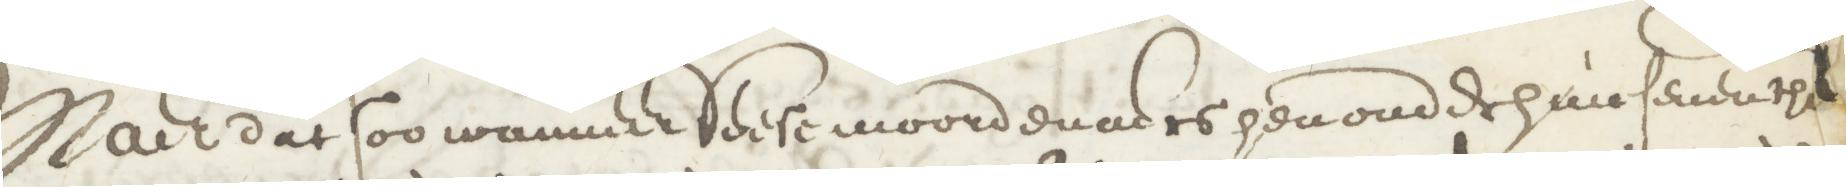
Waer dat soo wanneer deese moordenaers hen onder hun seventh
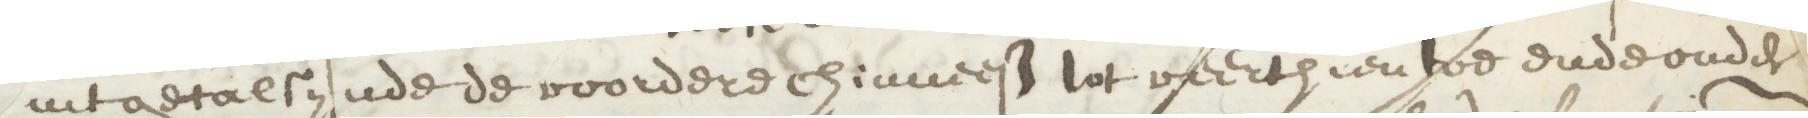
int getal synde de voordere chinneesz tot veerthien toe ende onder
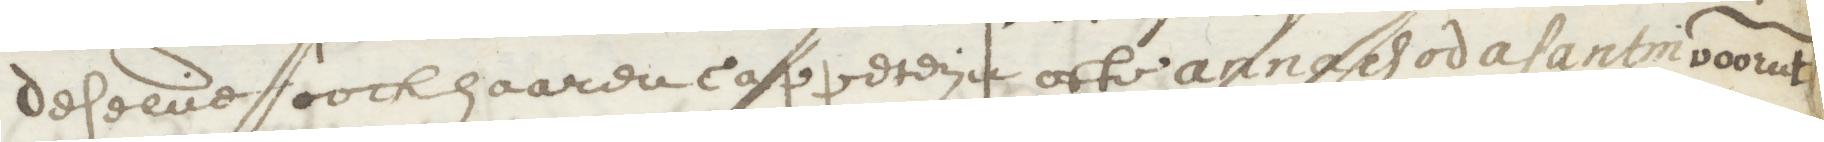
deselve oock haeren cappeteijn offe annachodafantin voornt
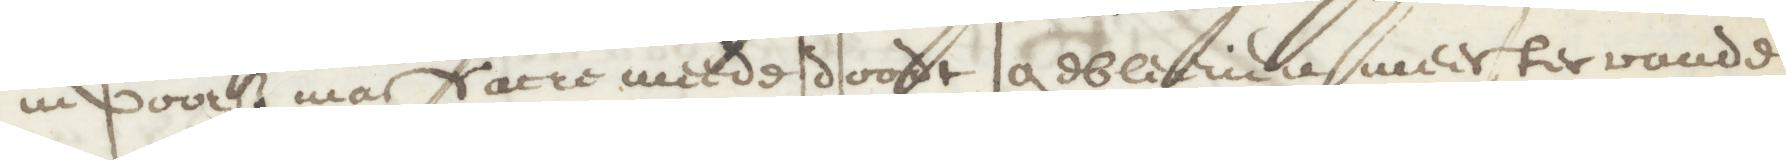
in voorsz massacre met de doodt gebleeuen meester vande
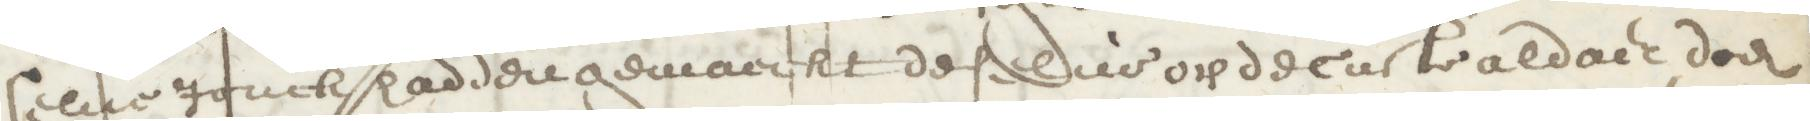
selve Ionck hadden gemaeckt deselue op de custe aldaer doen
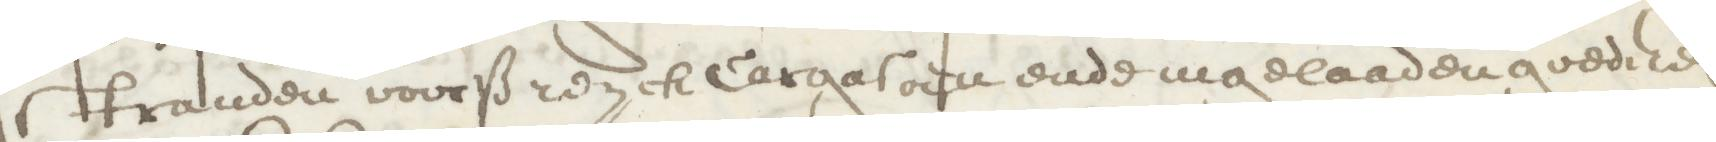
stranden voorsz reyck Cargasoen ende ingelaaden goederen
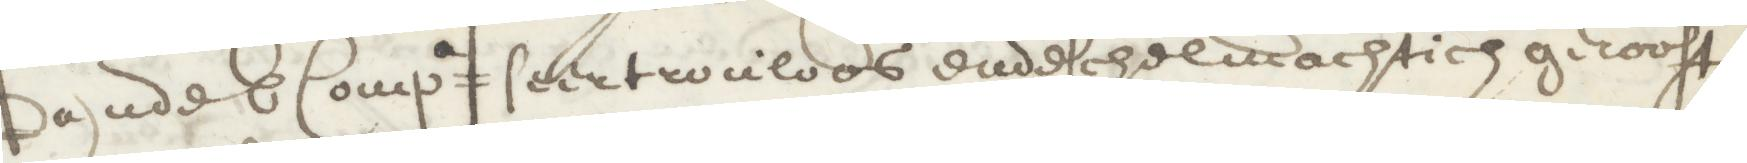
vande E Comp=a seer trouloos ende schelmachtich gerooft
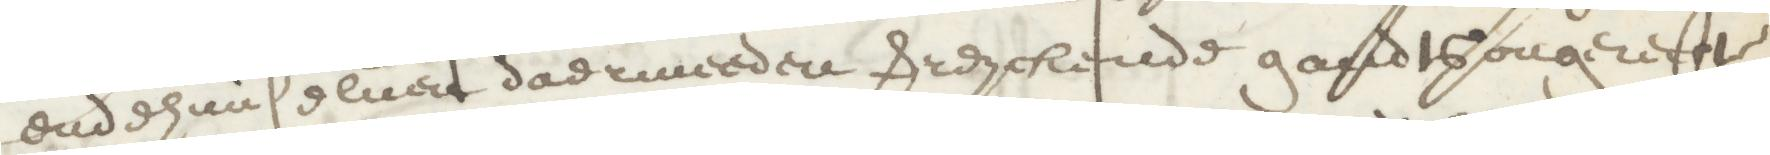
ende hun selven daermeeden verreyckende gandts ongerechte
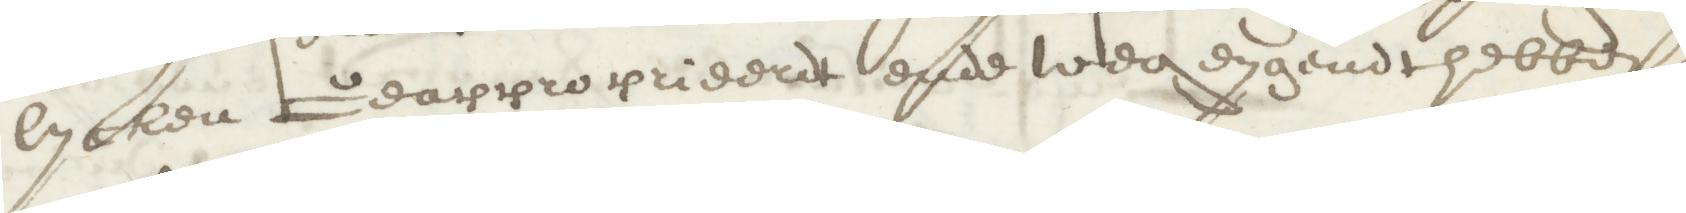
lycken Geapproprieerd ende toegeygendt hebben
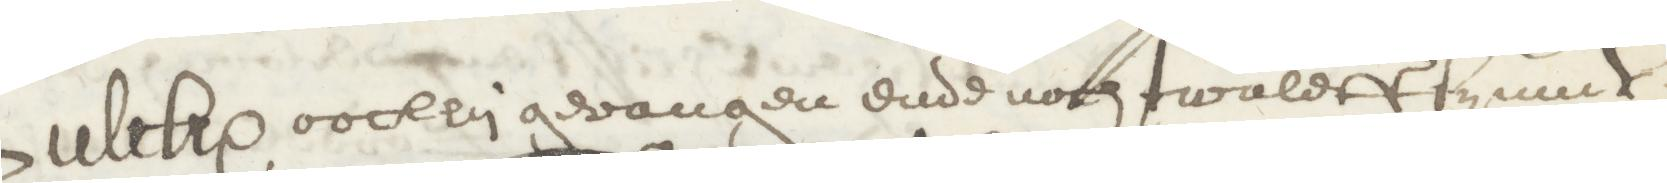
Sulkx oock hij gevangen ende noch twaeleff hunl
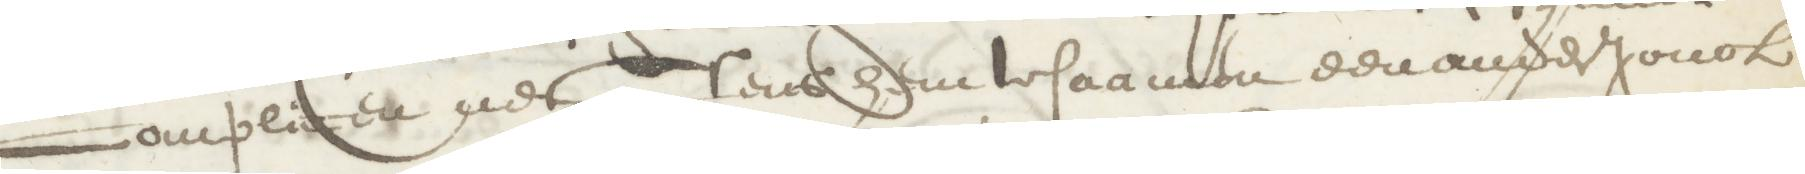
Complicen neffens hem tesaamen een ander jonck
